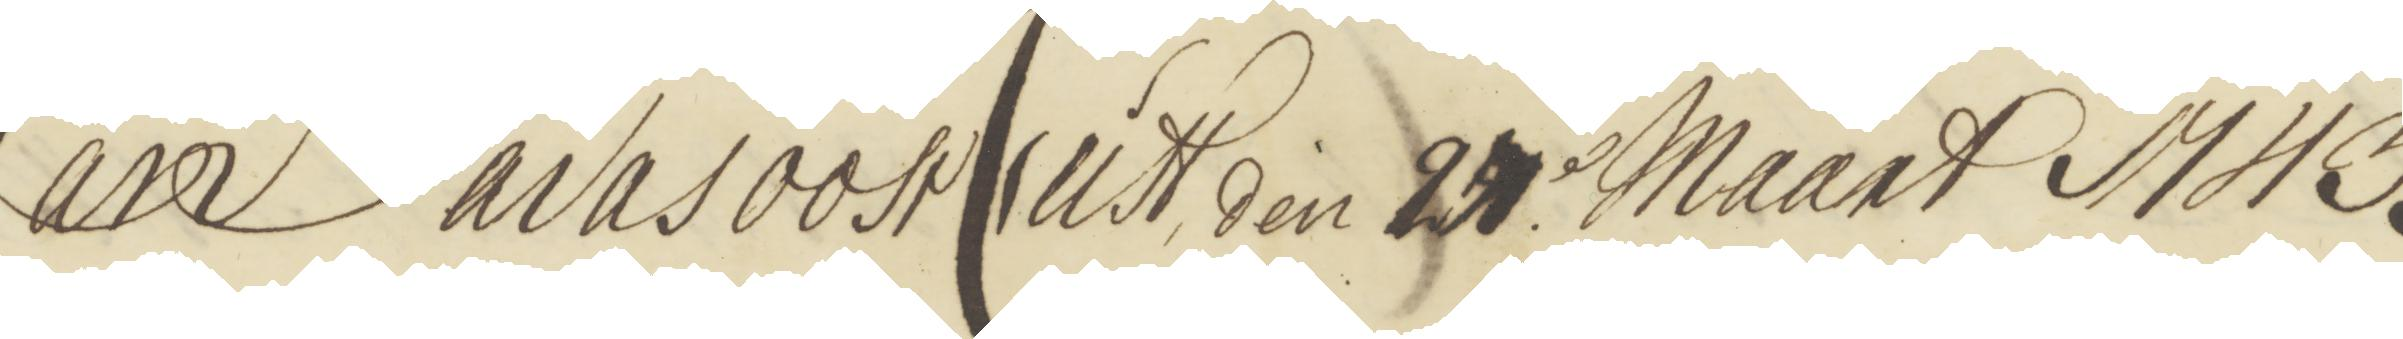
Van Iavas oost Cust, den 27.e Maart 1743
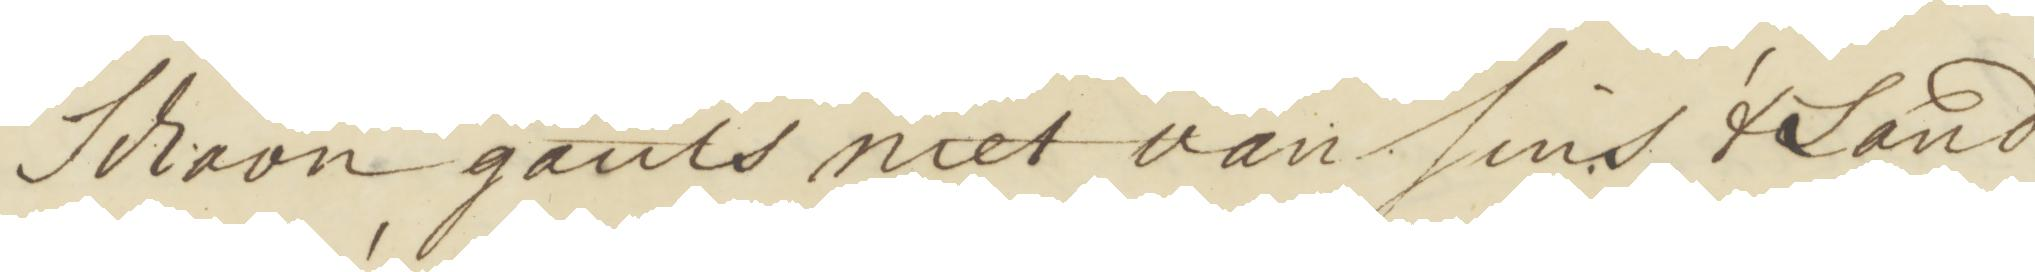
schoon gants niet van sins 't land
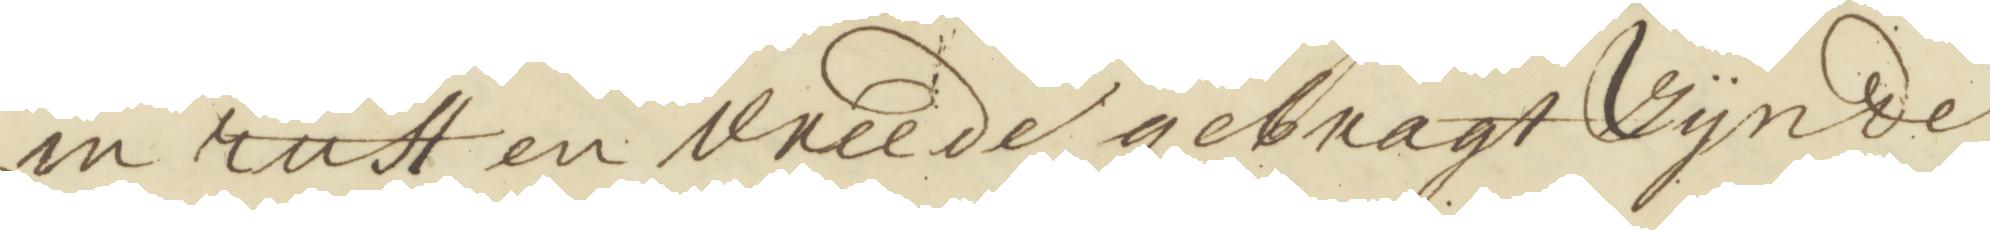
in rust en vreede gebragt zijnde,
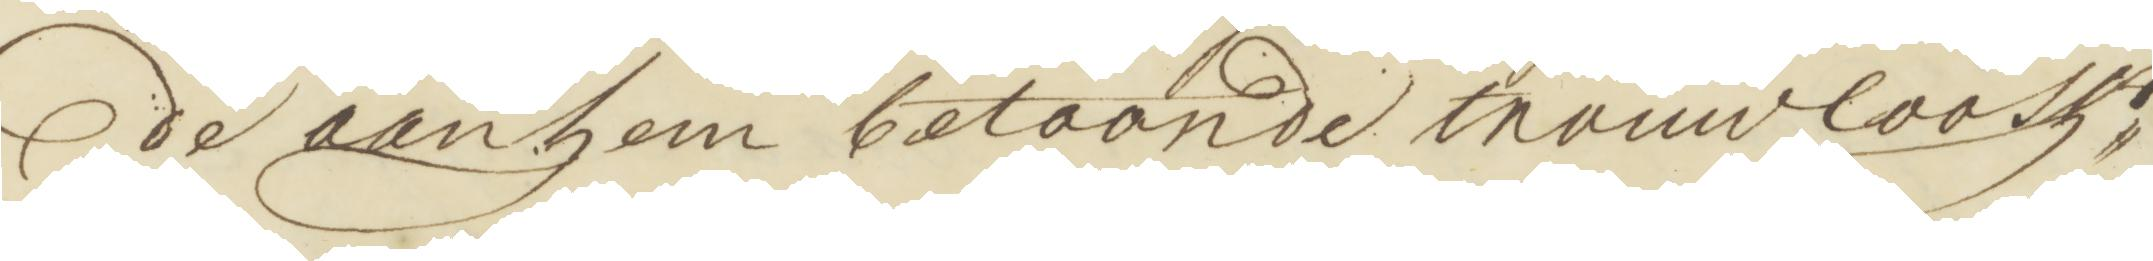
de aan hem betoonde trouwloosh„t
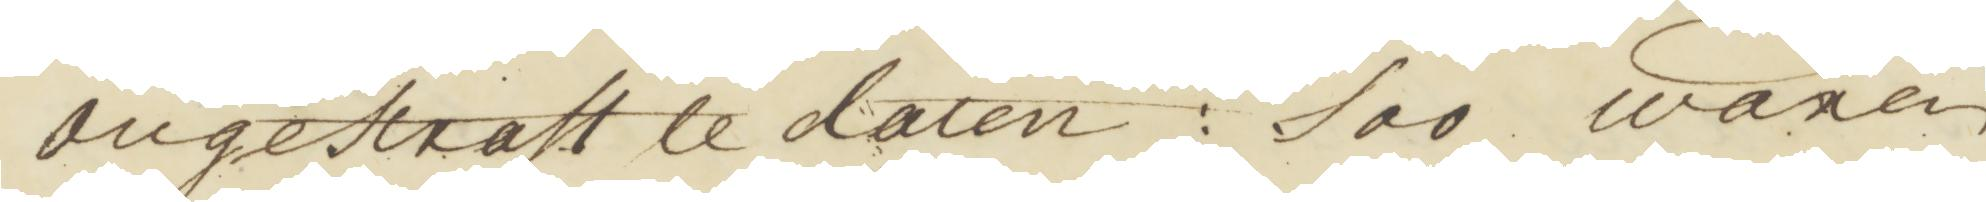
ongestraft te laten: soo waren
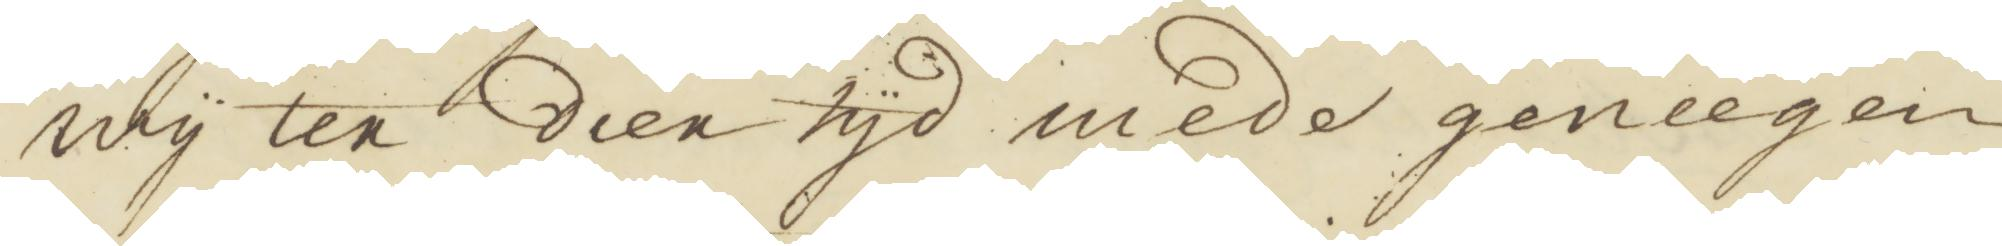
wij ter dier tijd mede geneegen
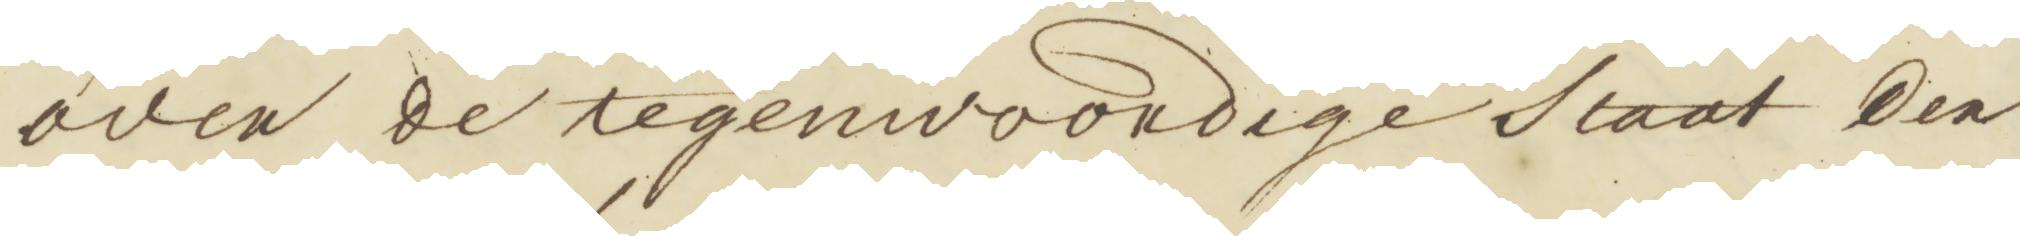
over de tegenwoordige staat der
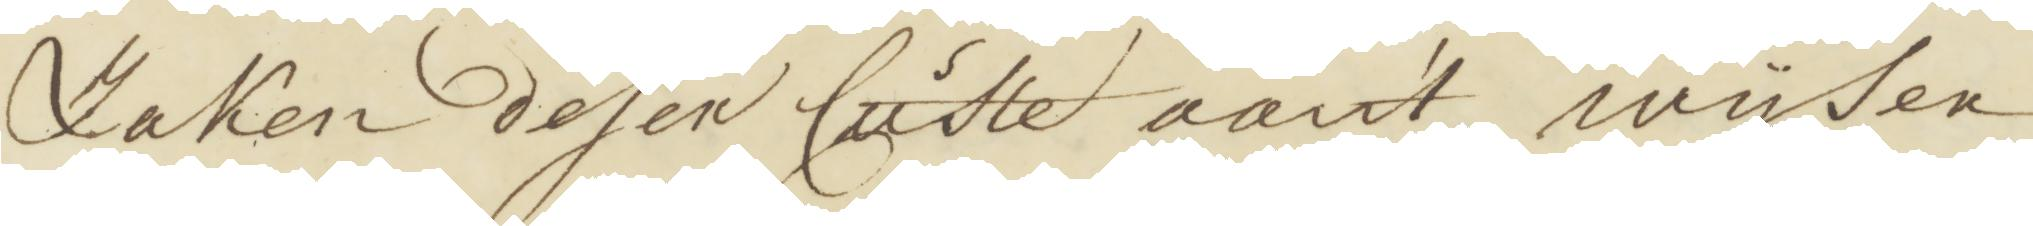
Zaken deser Custe aan't wijser
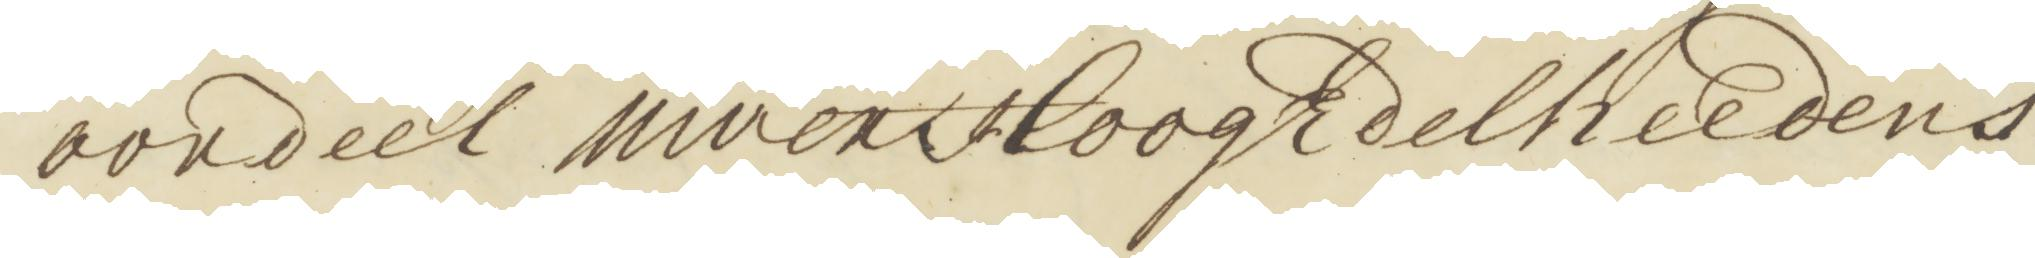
oordeel uwer Hoog Edelheedens
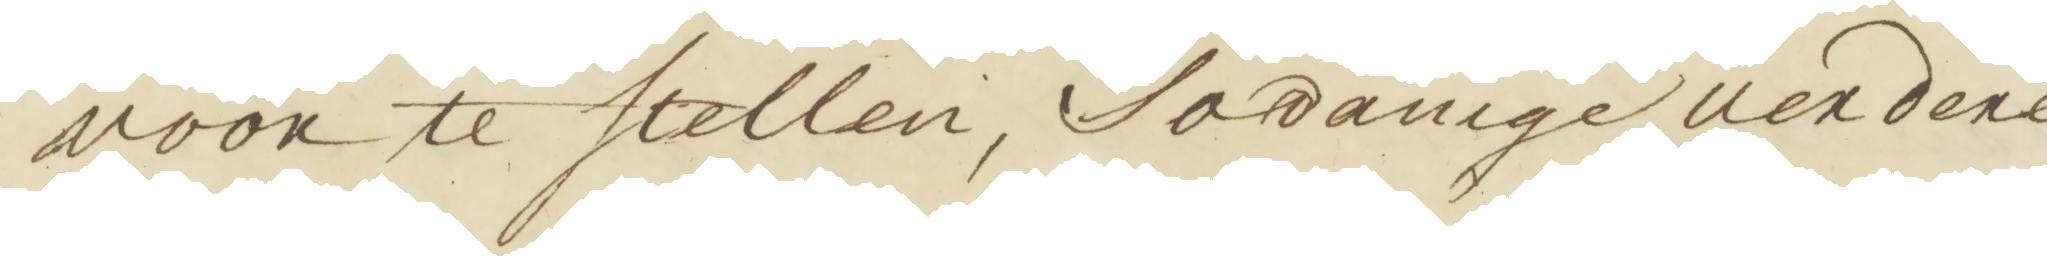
voor te stellen, sodanige verdere
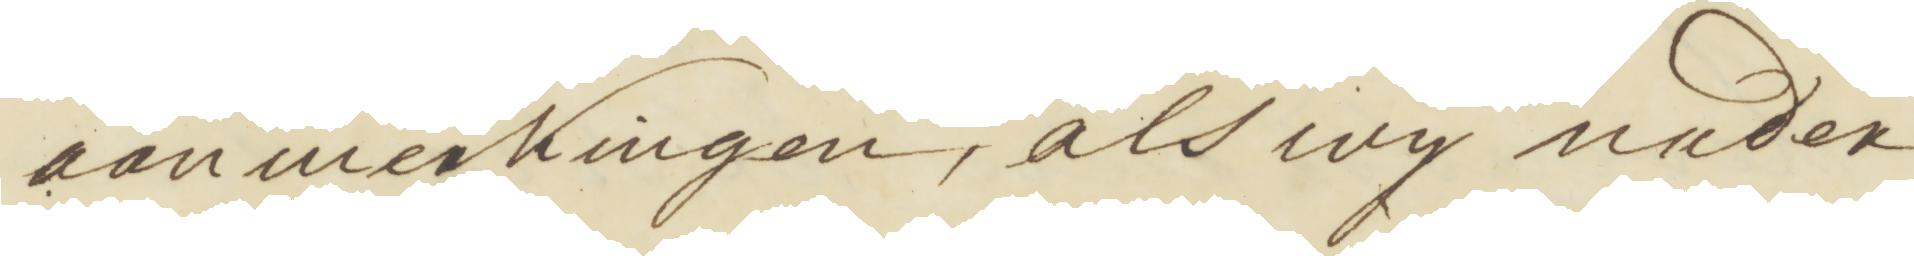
aanmerkingen, als wij nader
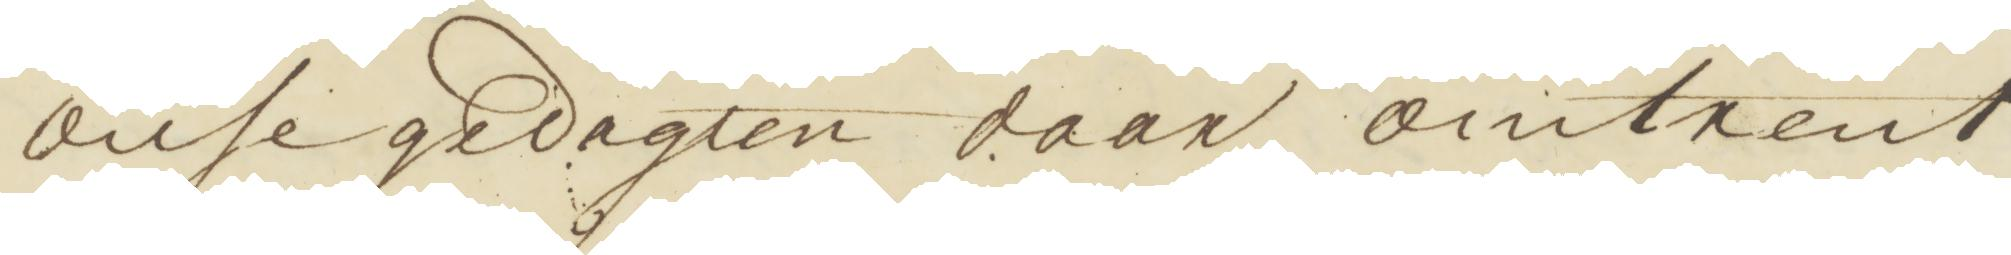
onse gedagten daar omtrent
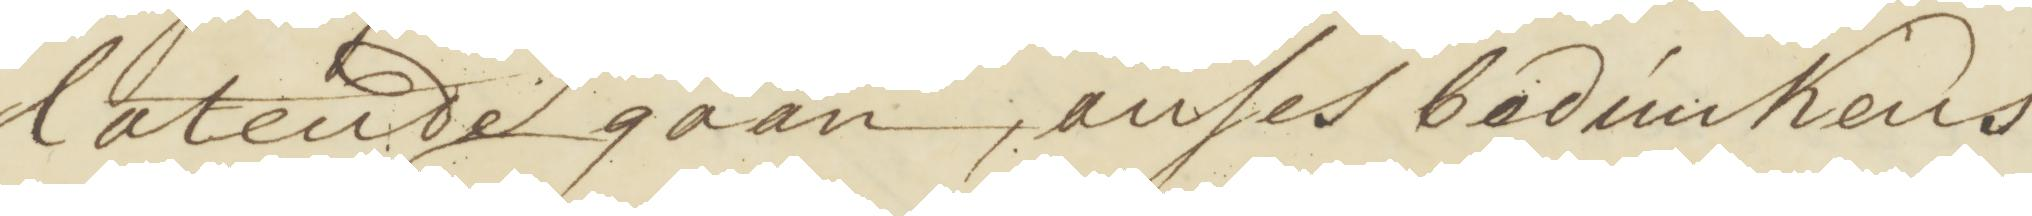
latende gaan, onses bedunkens
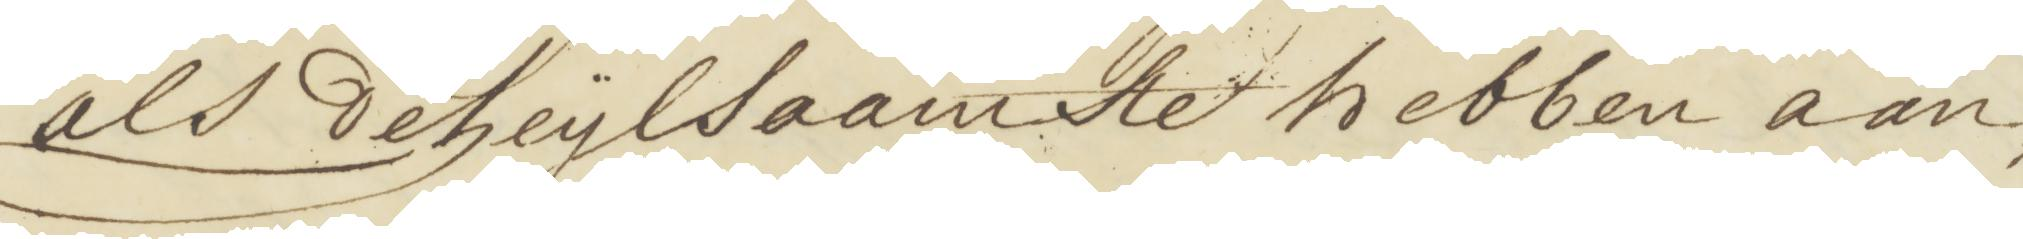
als deheijlsaamste hebben aan
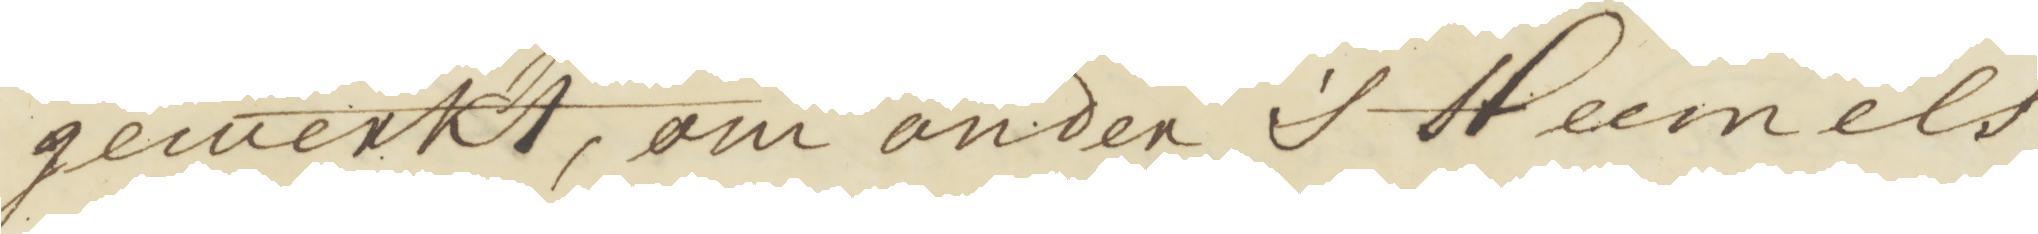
gemerkt, om onder 's Heemels
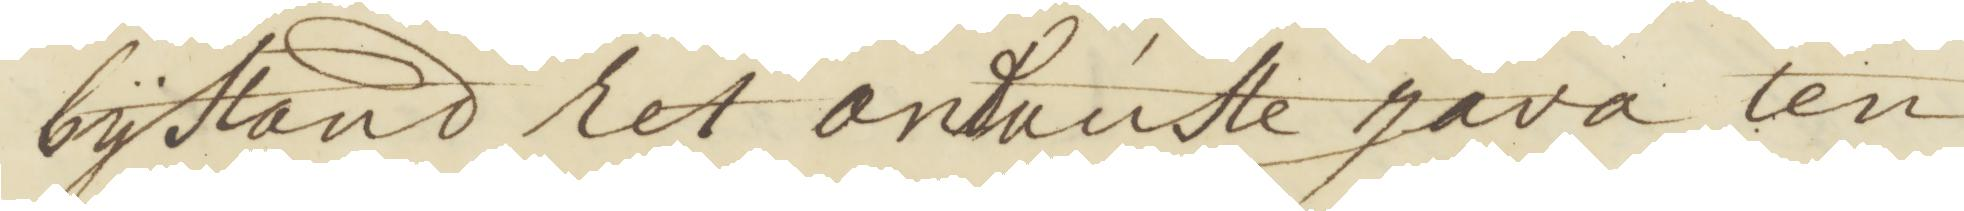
bijstand het ontruste Java ten
